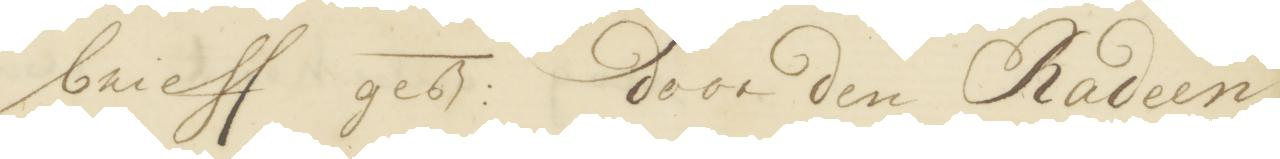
brieff ges: door den Radeen
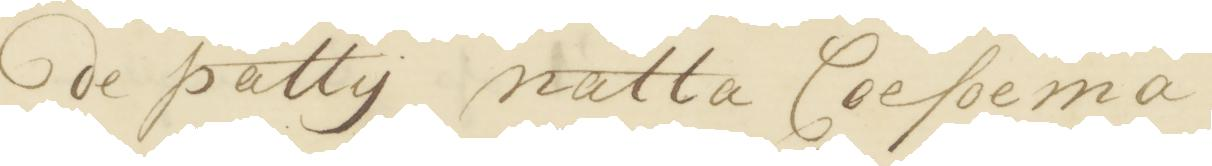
de pattij natta Coesoema
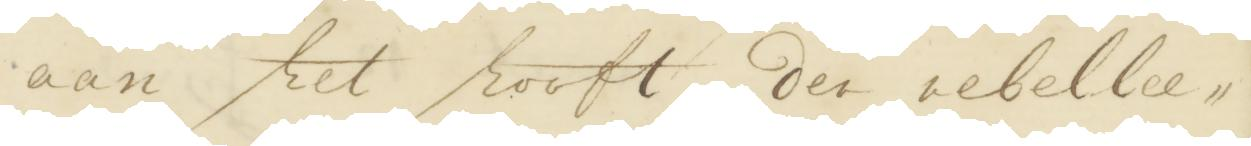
aan het hooft der rebellee„
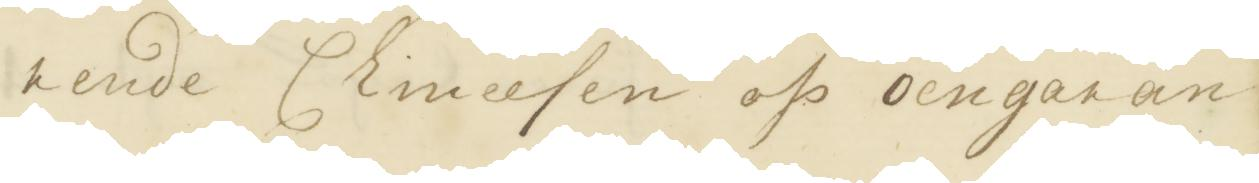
rende Chineesen op oengaran
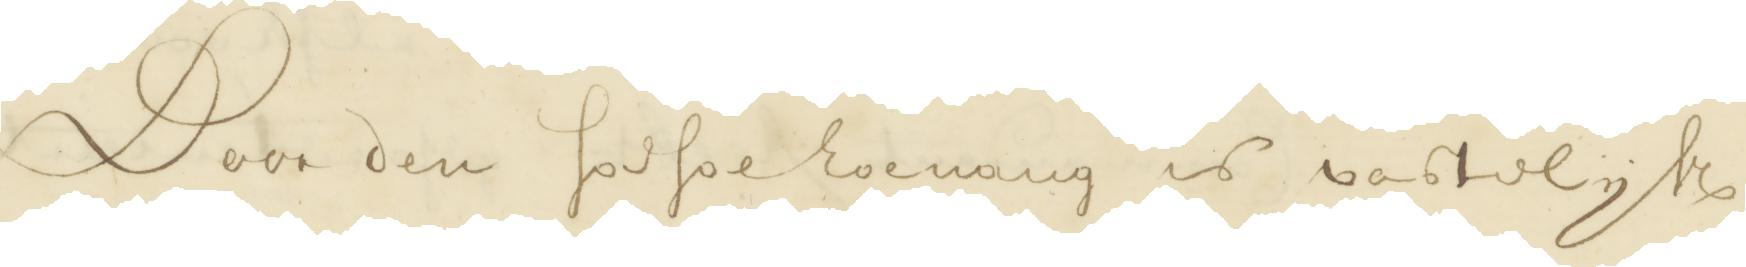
Door den soesoe hoenang is vastelijk
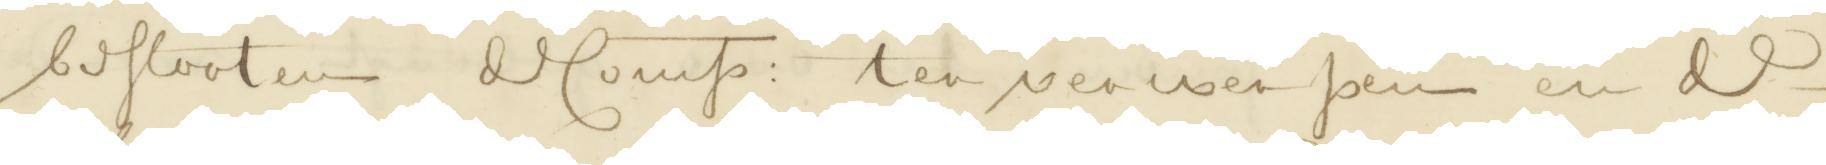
beslooten de Comp: ter verwerpen en de
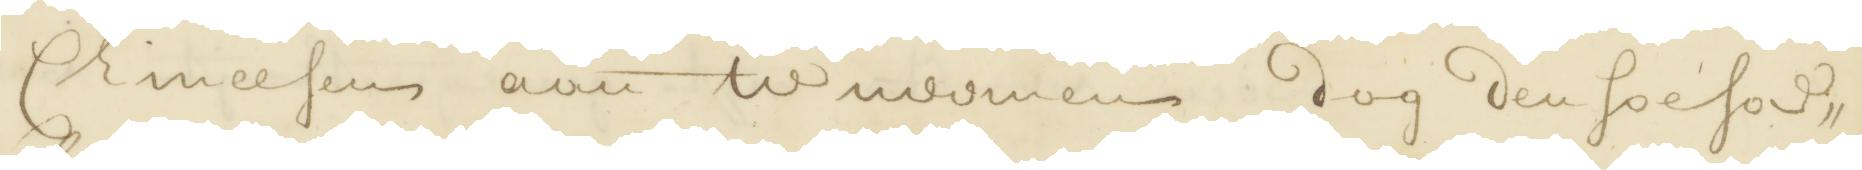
Chineesen aan te neemen dog den soesoe„
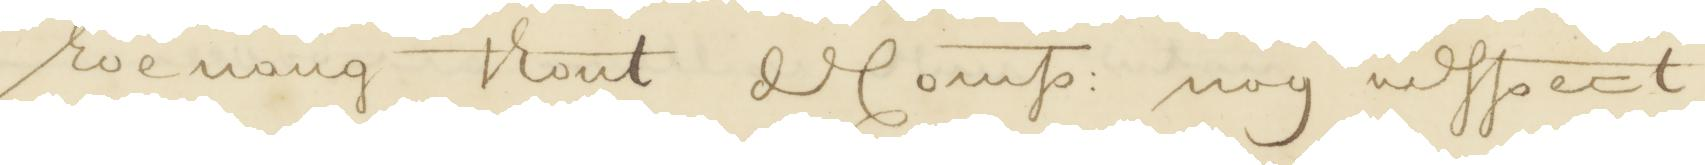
hoenang Tont de Comp: nog respect
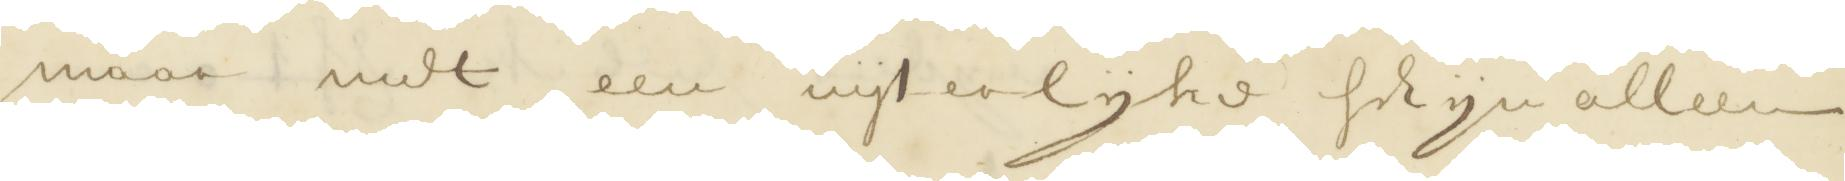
maar met een uijterlijke schijn alleen
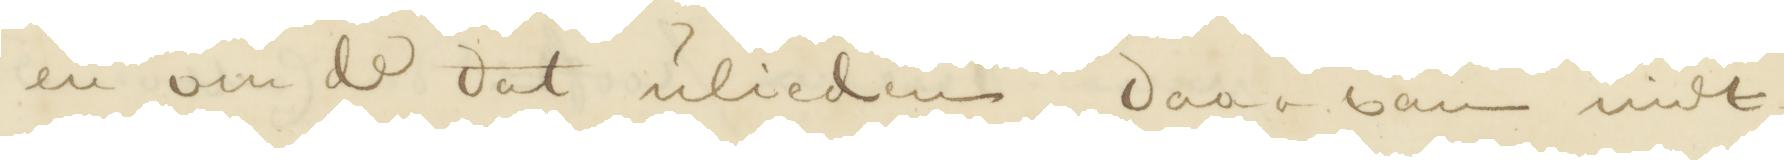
en om de dat ulieden daar van niet
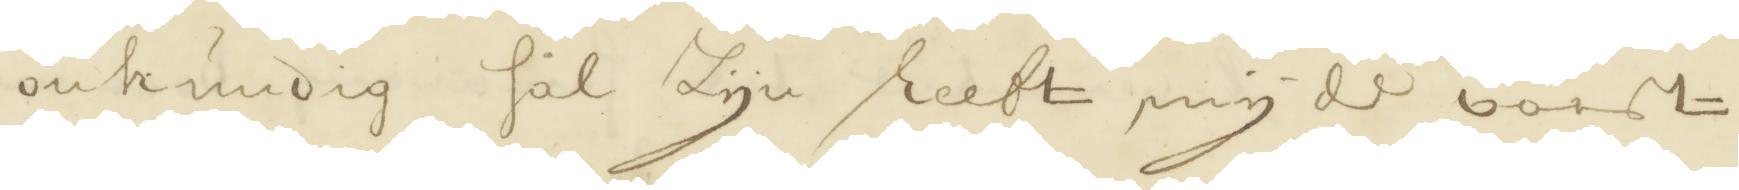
onkundig sal zijn heeft mij de vorst
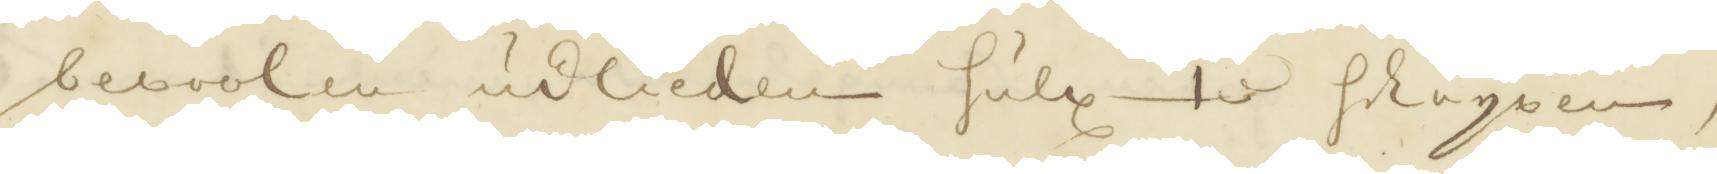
bevoolen uelieden sulx te schrijven,
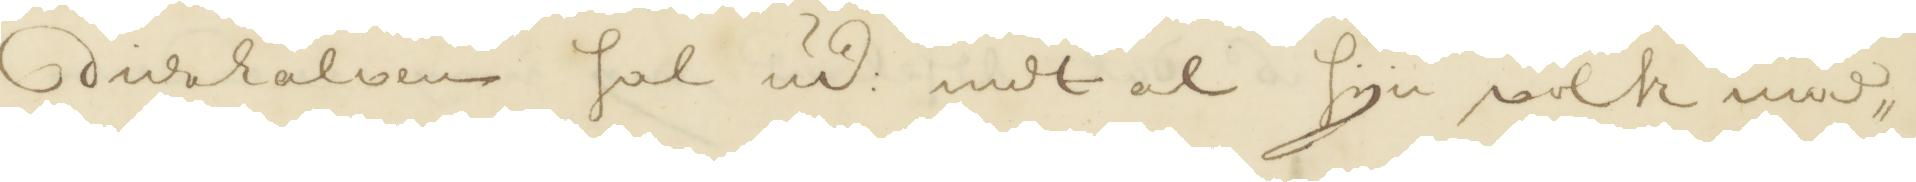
dierhalven sal ue: met al sijn volk moe„
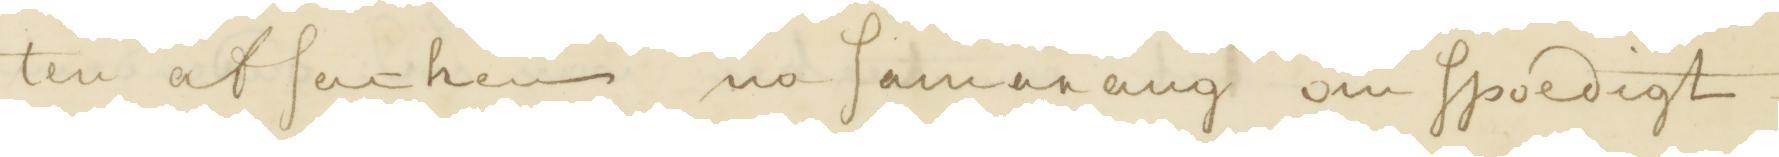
ten afsacken na Samarang om spoedigt
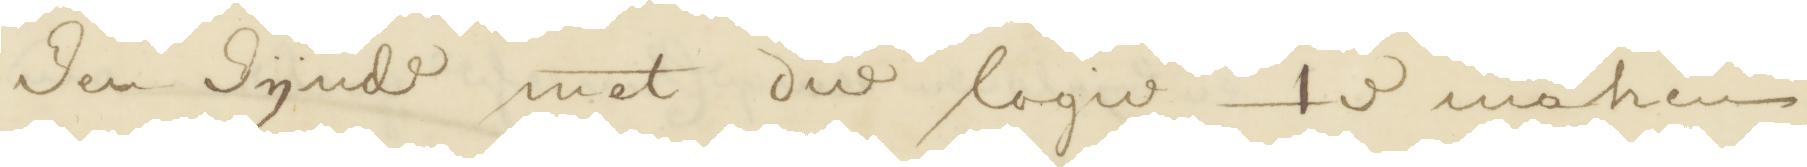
een eijnde met die logie te maken
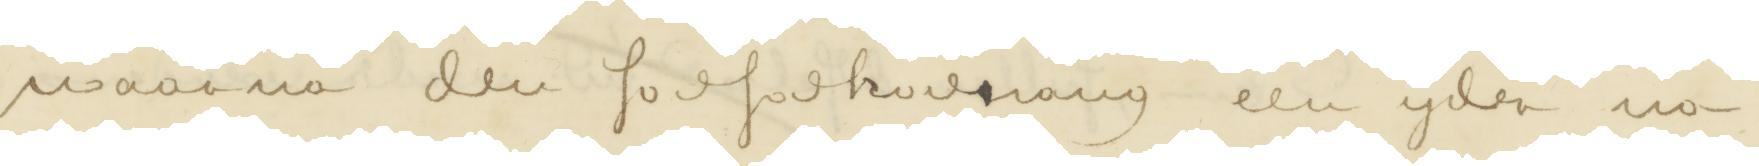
waarna den soesoekoenang een ijder na
